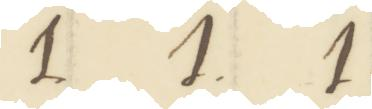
1. 1. 1
